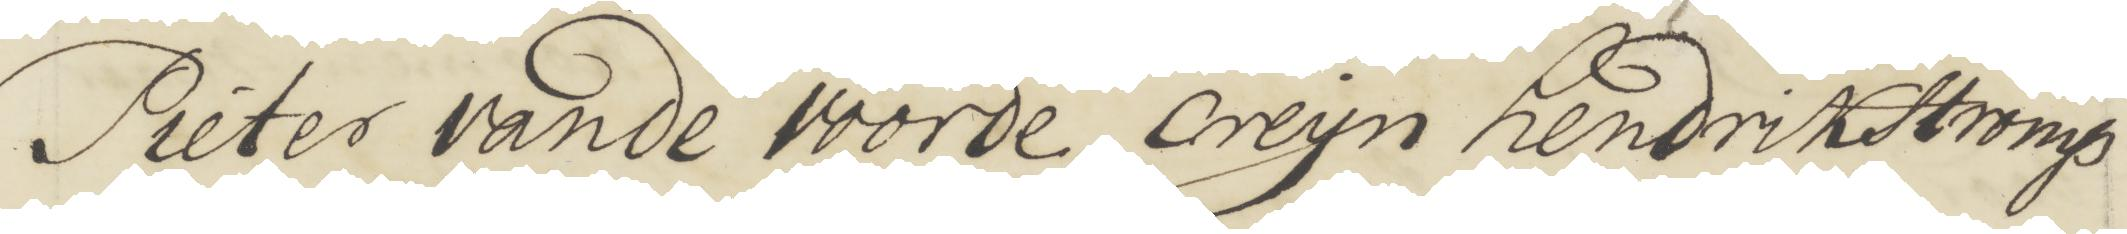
Pieter vande Voorde, Creijn hendrikstromp
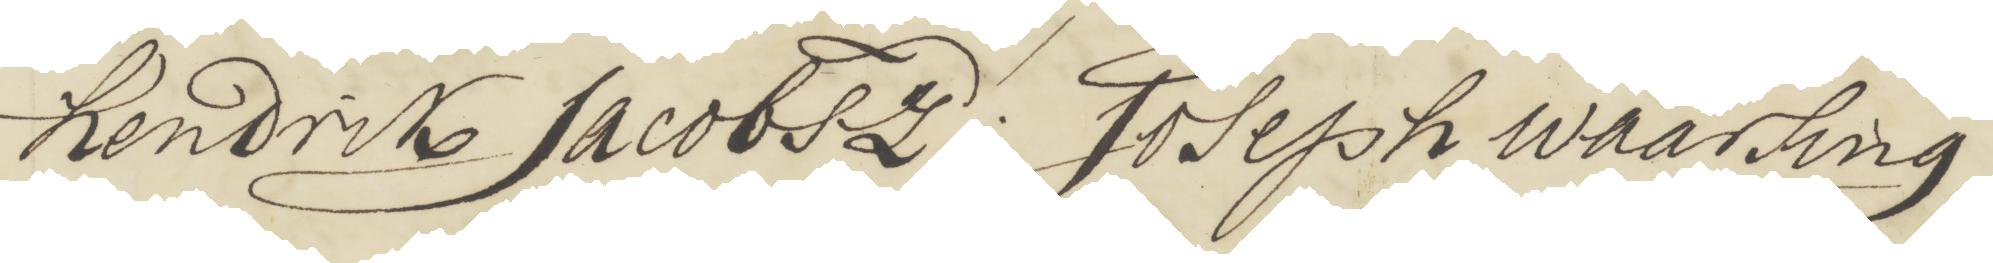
hendrik Jacobsz; Joseph waarsing
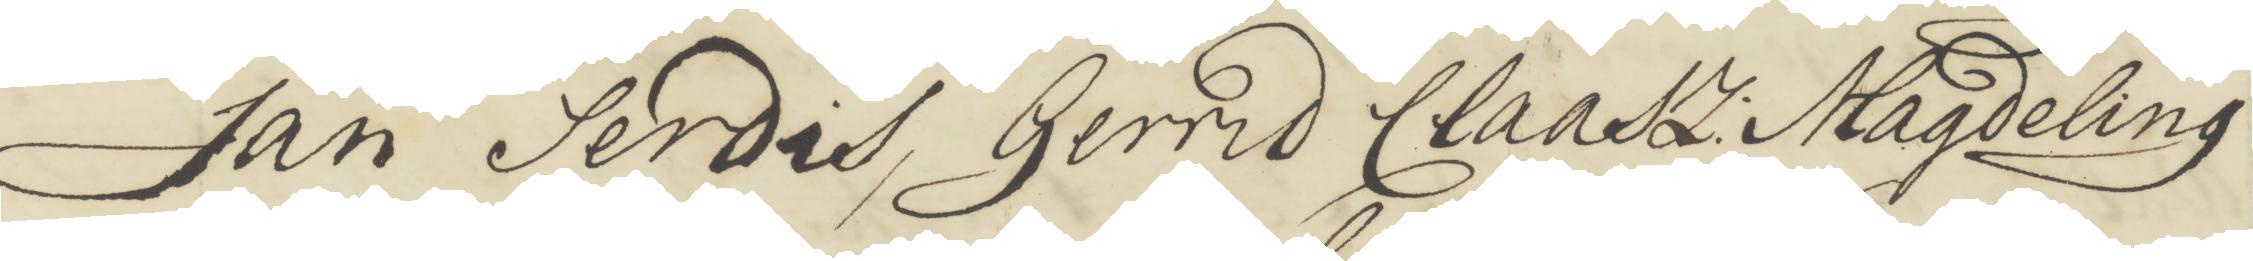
Ian serdis, Gerrid Claasz: Magdeling
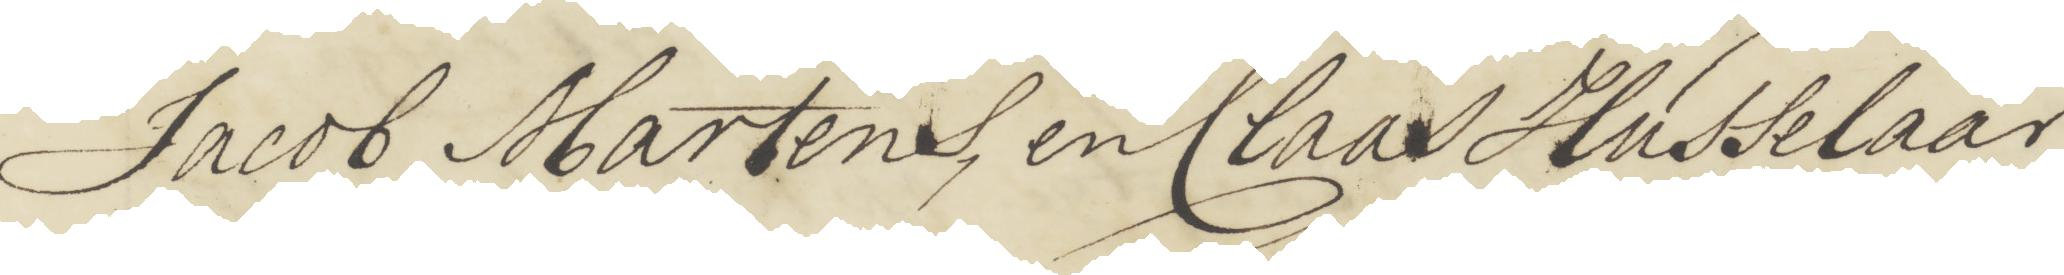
Iacob Martens, en Claas Husselaar
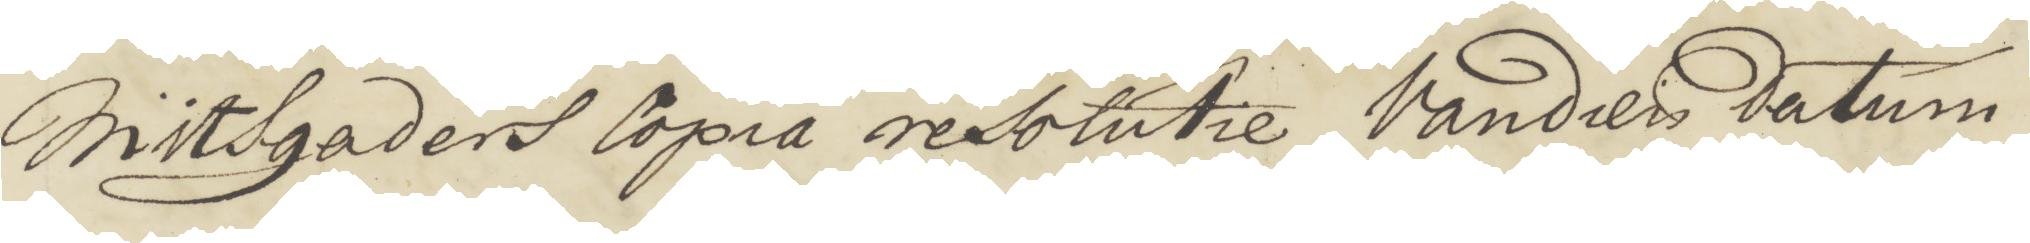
Mitsgaders Copia resolutie Vandien datum
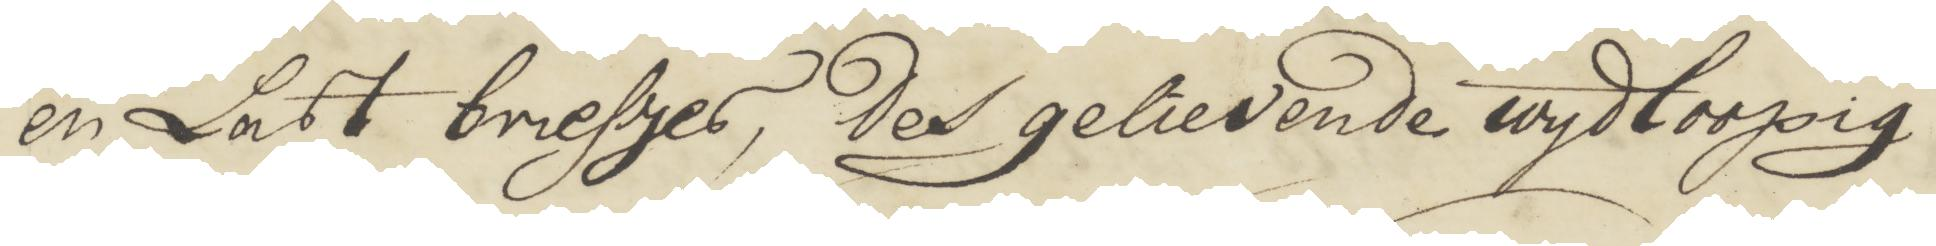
en Last briefjes, des gelievende wydloopig
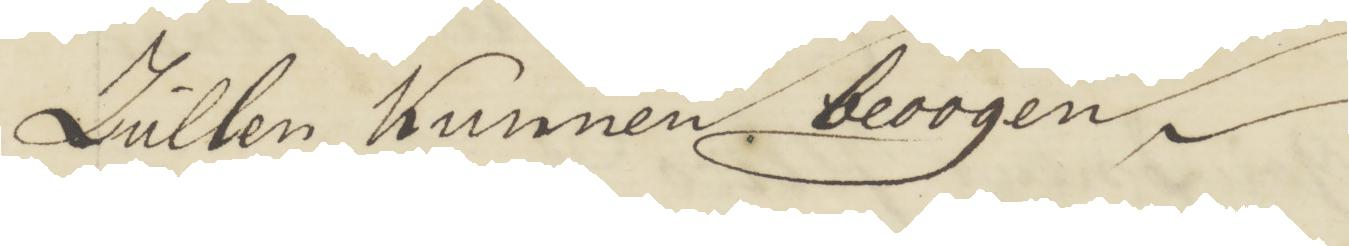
zullen kunnen beoogen —
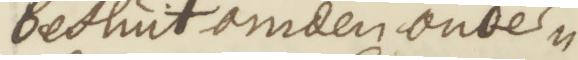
besluit omden onder„
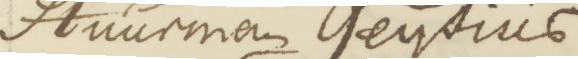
stuurman Geijsius
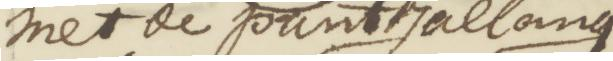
met de pantjallang
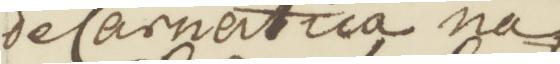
de Carnatica na
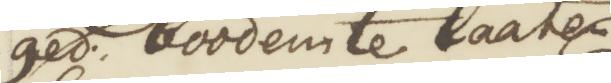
ged: boodem te laaten
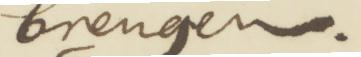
brengen.
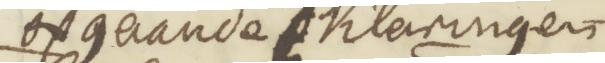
over gaande verklaringen
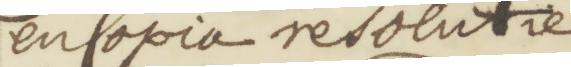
en Copia resolutie
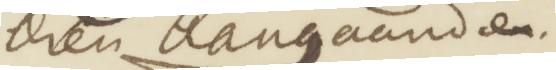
dien Aangaanden.
